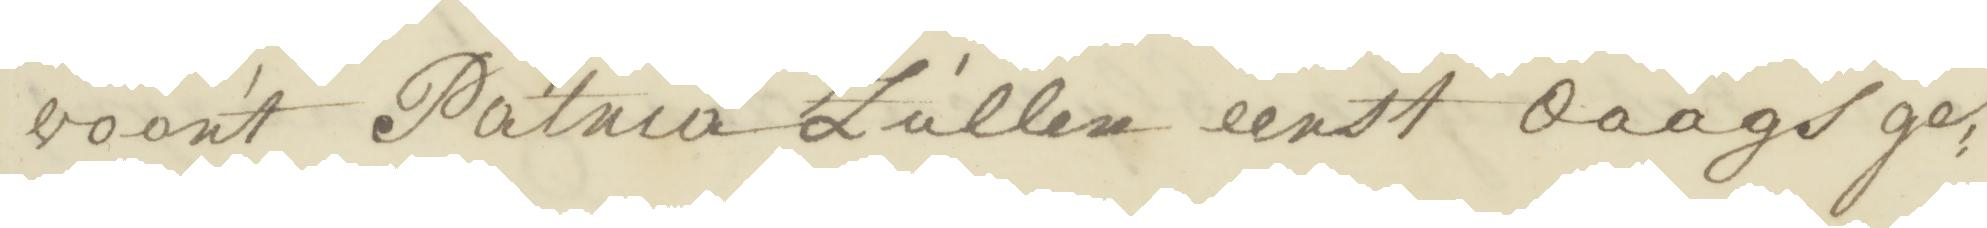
voor't Patria, zullen eerst daags ge„
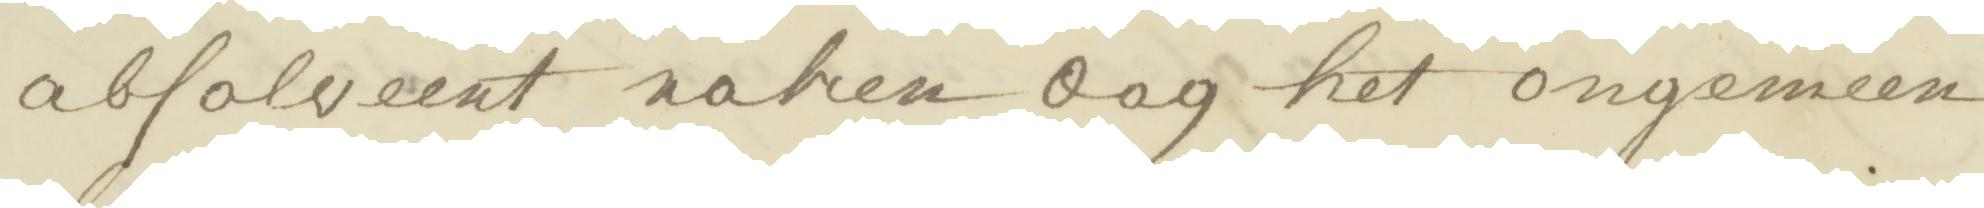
absolveert raken, dog het ongemeen
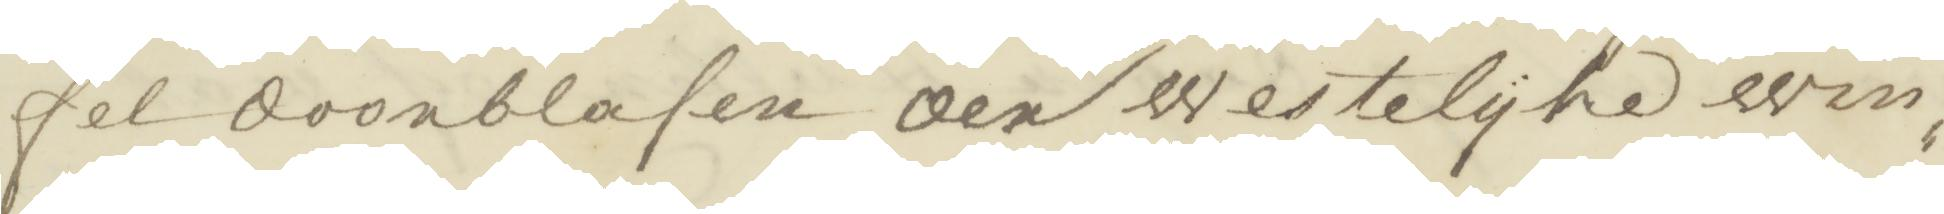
fel doorblasen der westelijke win„
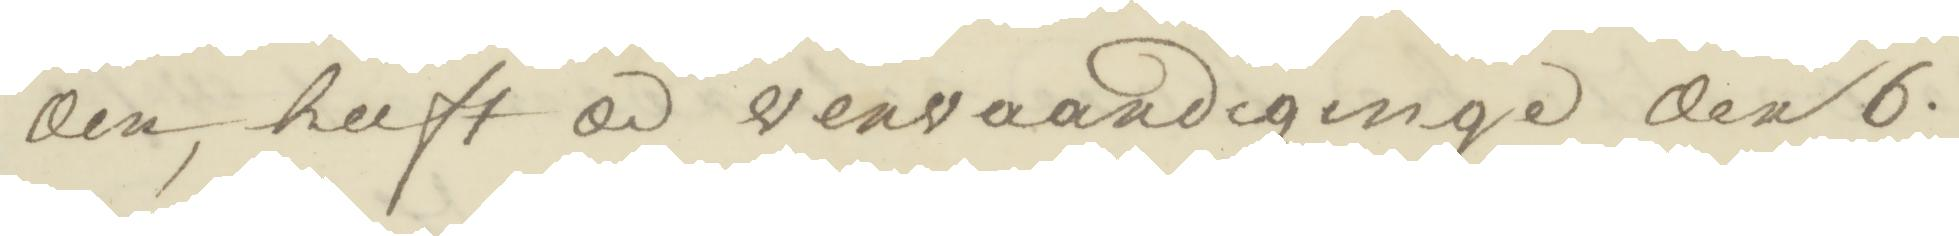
den, heeft de vervaardiginge der 6.
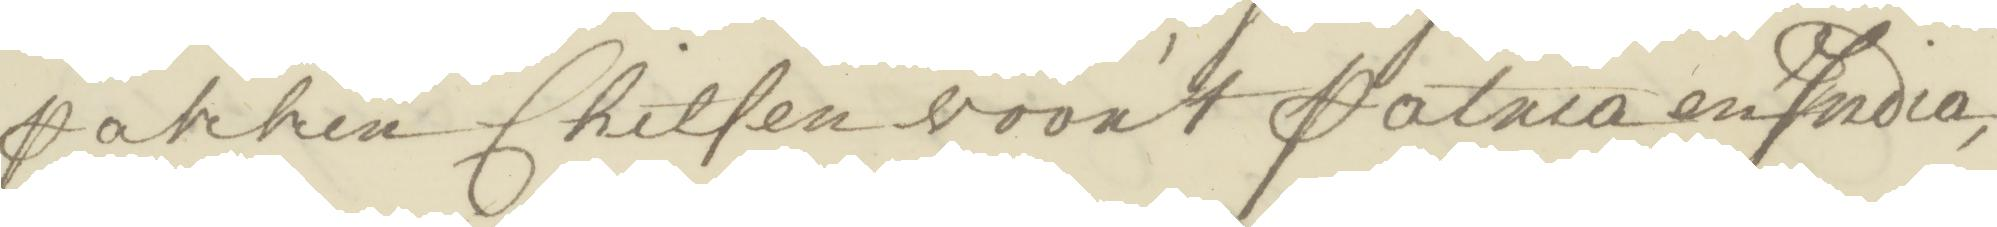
pakken Chitsen voor't Patria, en Jndia,
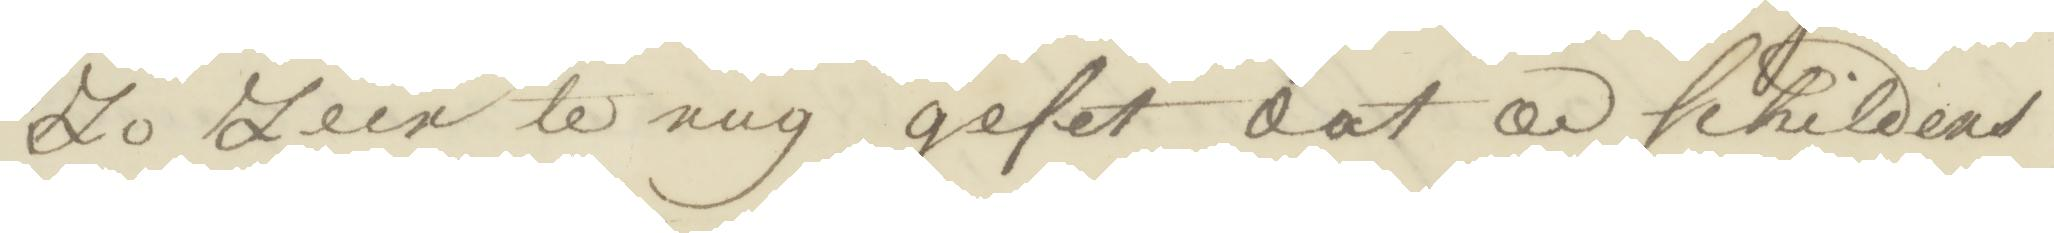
zo zeer te rug geset dat de schilders
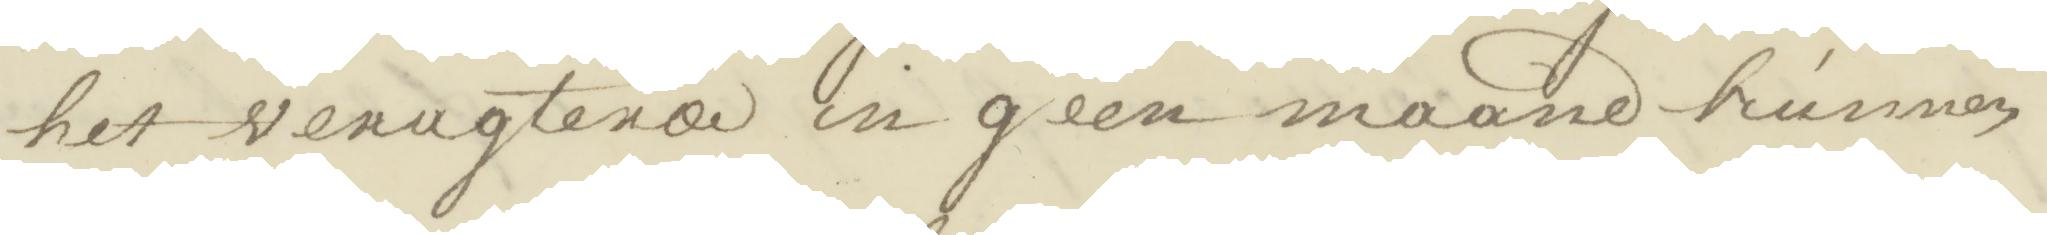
het veragterde in geen maand kunnen
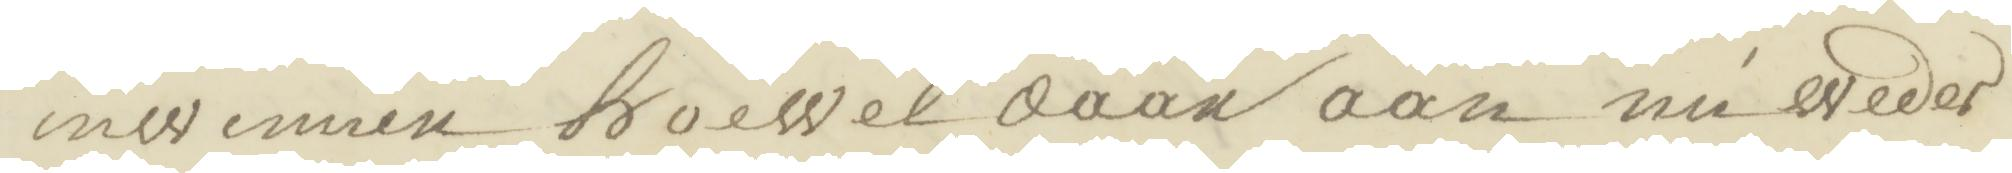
inwinnen, hoewel daar aan nu weder
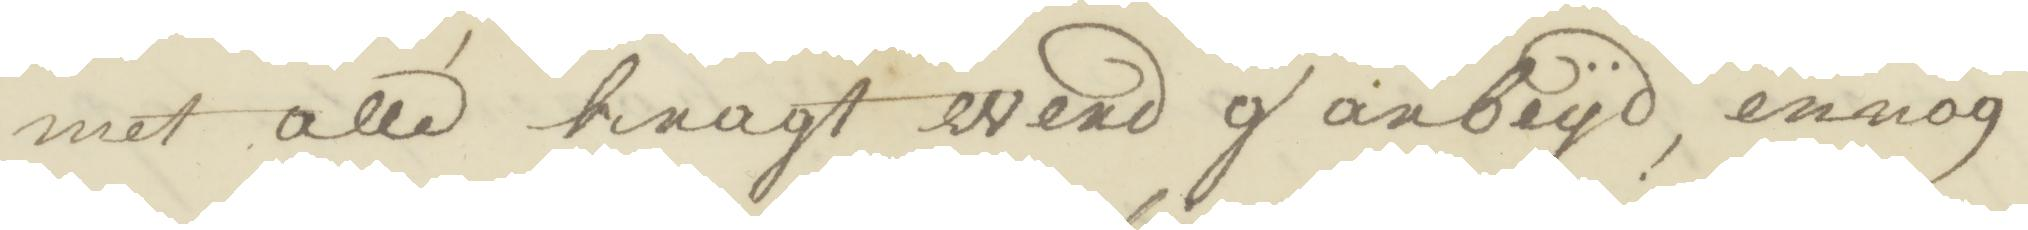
met alle kragt werd g'arbeijd, en nog
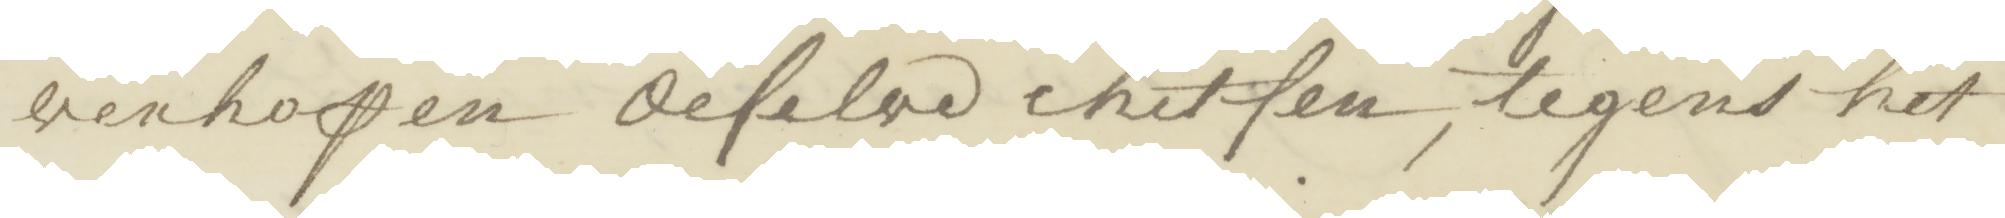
verhopen deselve chitsen, tegens het
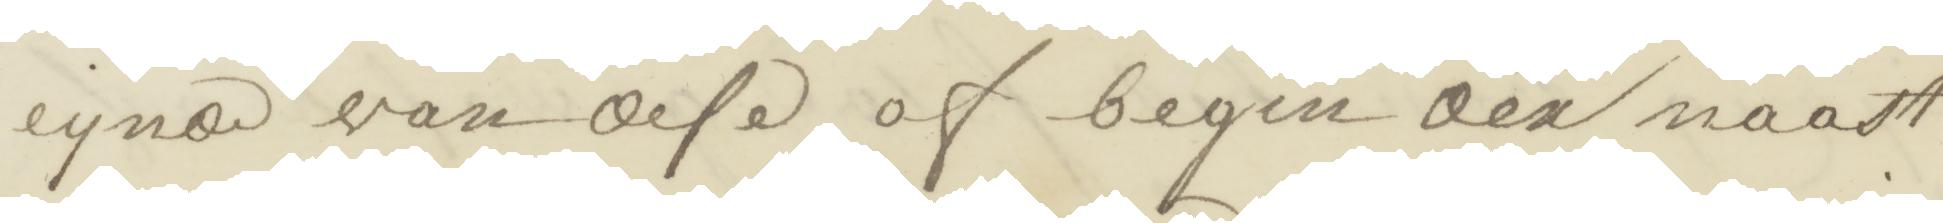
eijnde van dese, of begin der naast
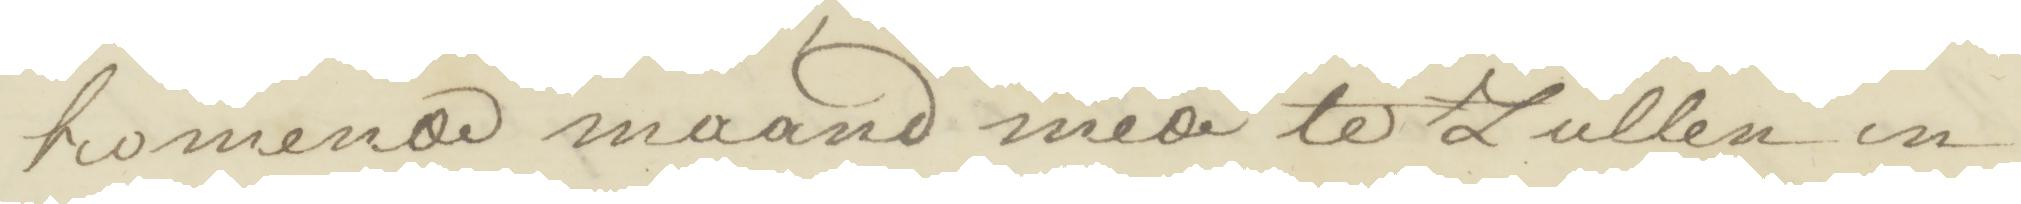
komende maand mede te zullen in
